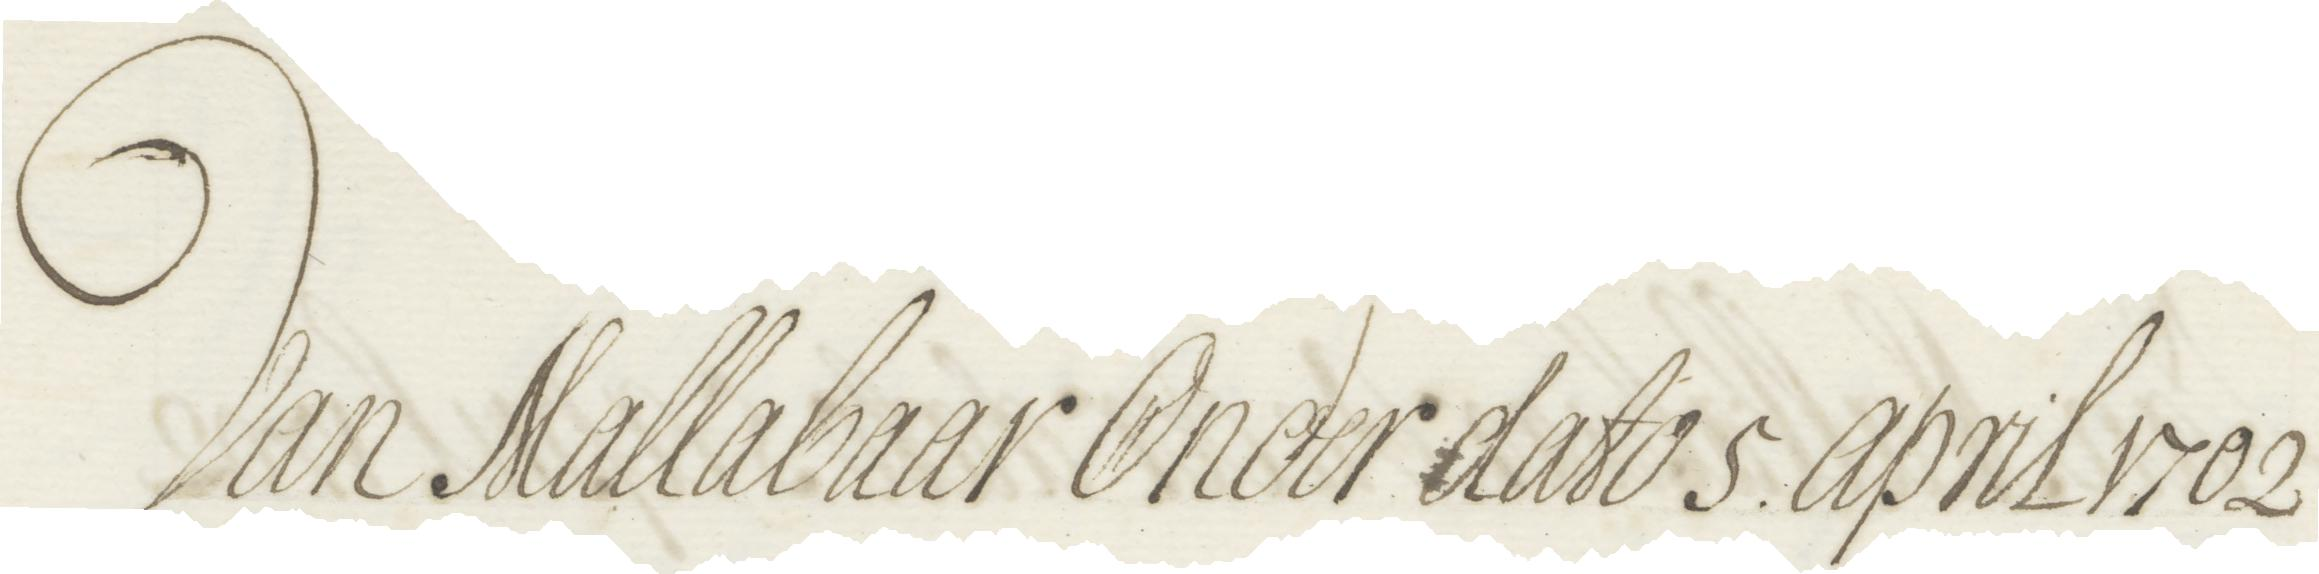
Van Mallabaar Onder dato 5. April 1702
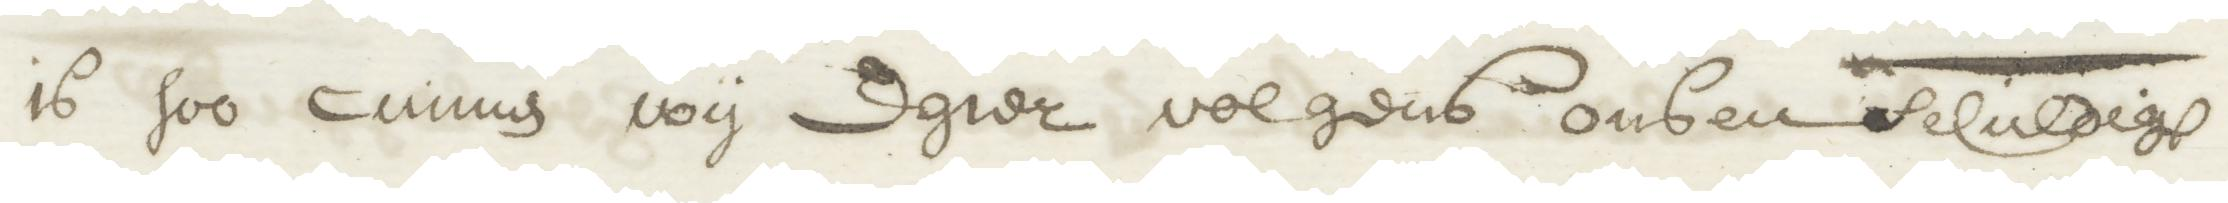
is soo cunnen wij Egter volgens onsen schuldige
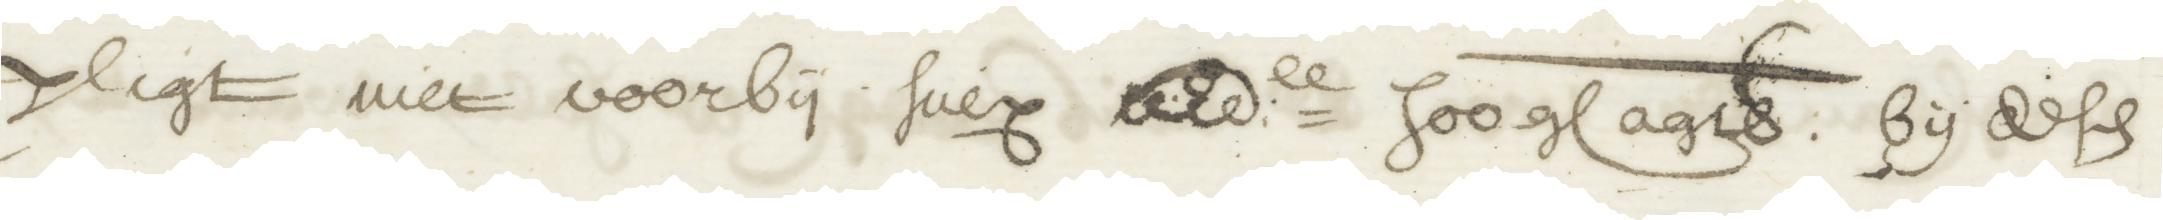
pligt niet voorbij sulx UEd=le hoogh agtb: bij dese
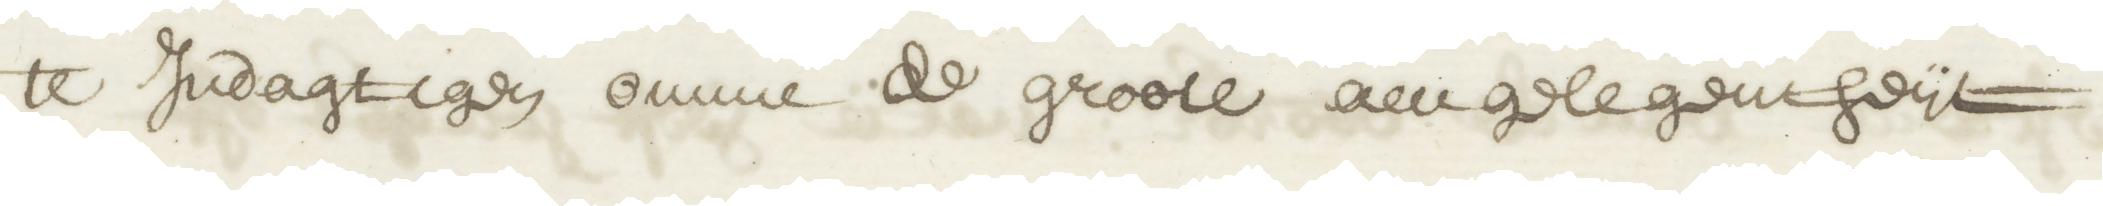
te Jndagtigen omme de groote aengelegentheijt
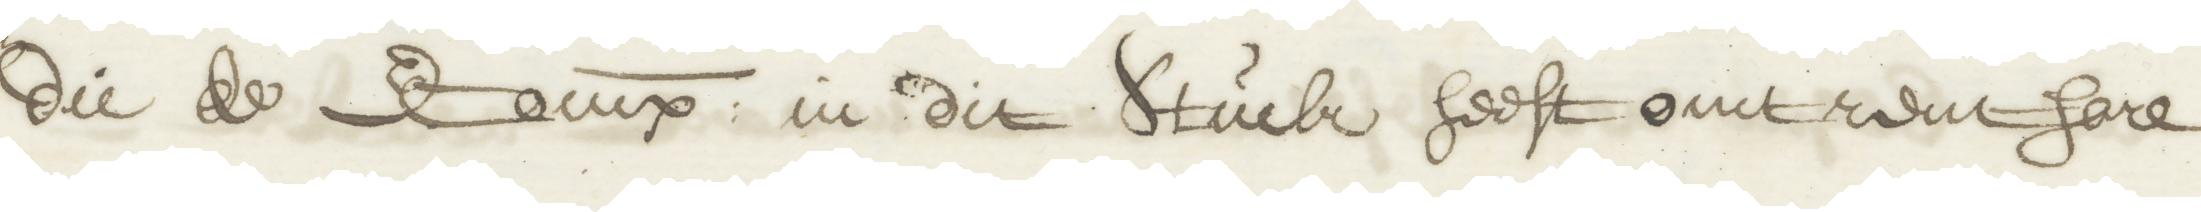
die de EComp: in dit stuck heeft omtrent hare
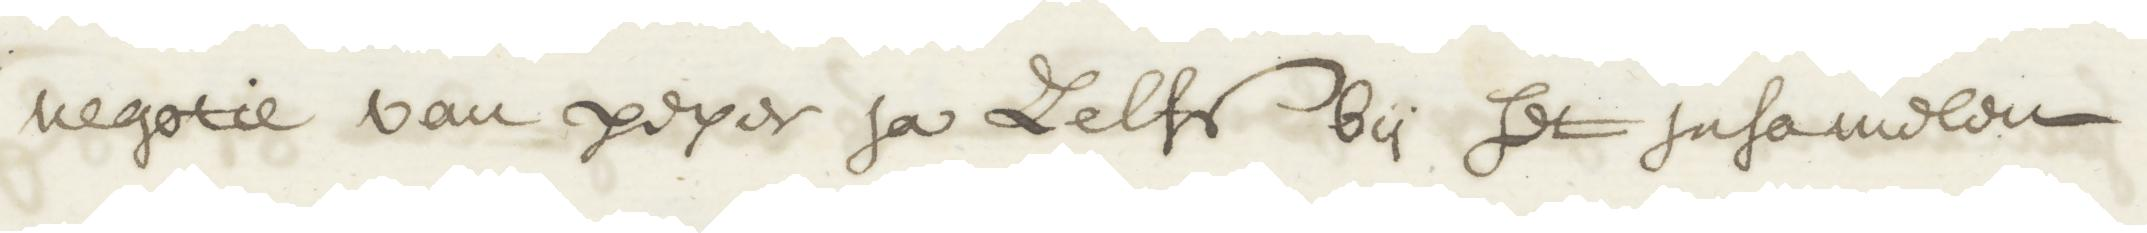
negotie van peper ja zelfs bij het jnsamelen
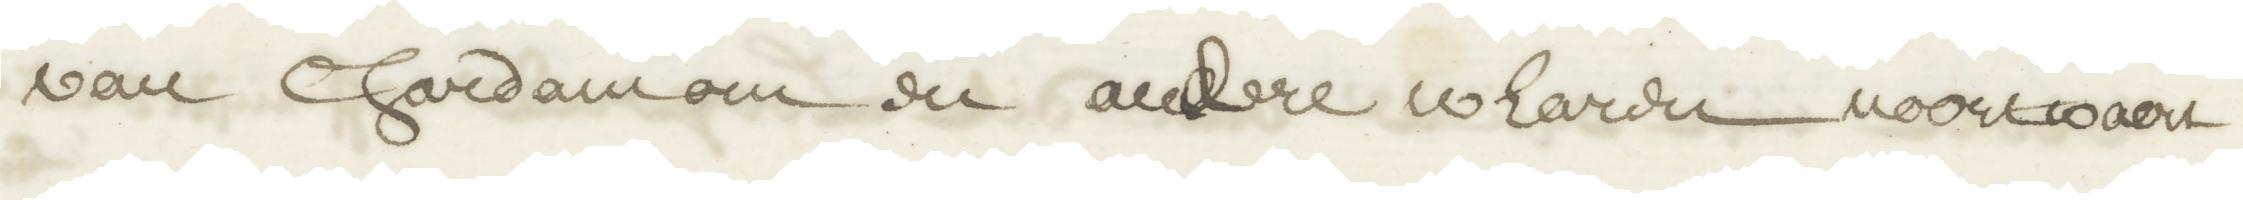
van Chardaman en andere wharen voortwaert
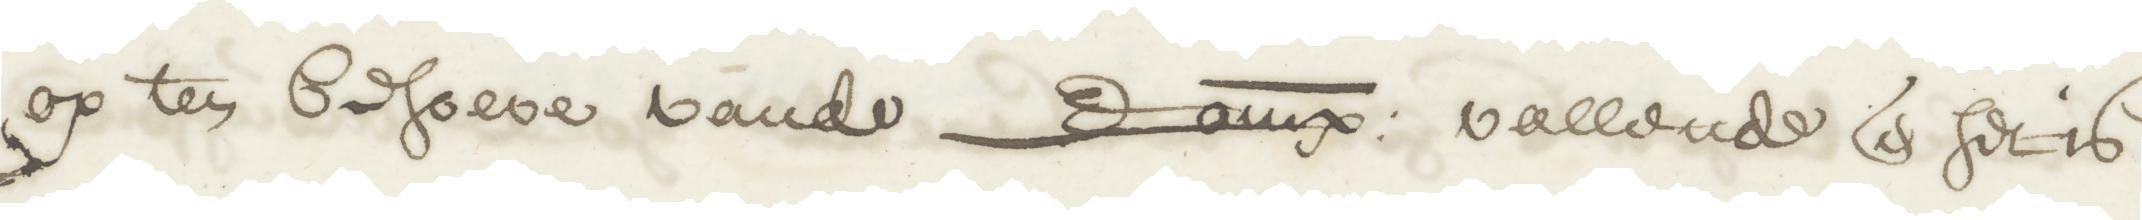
op ten behoeve vande Comp: vallende en het is
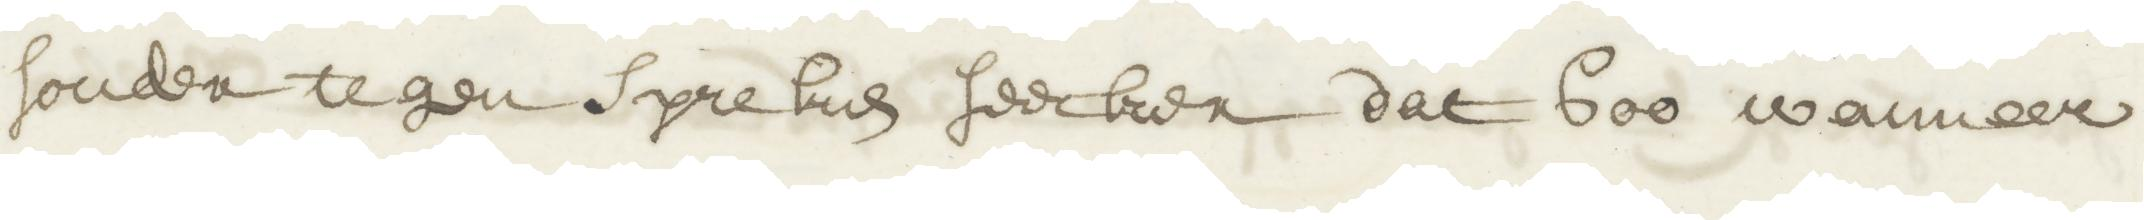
sonder tegen spreken seecker dat soo wanneer
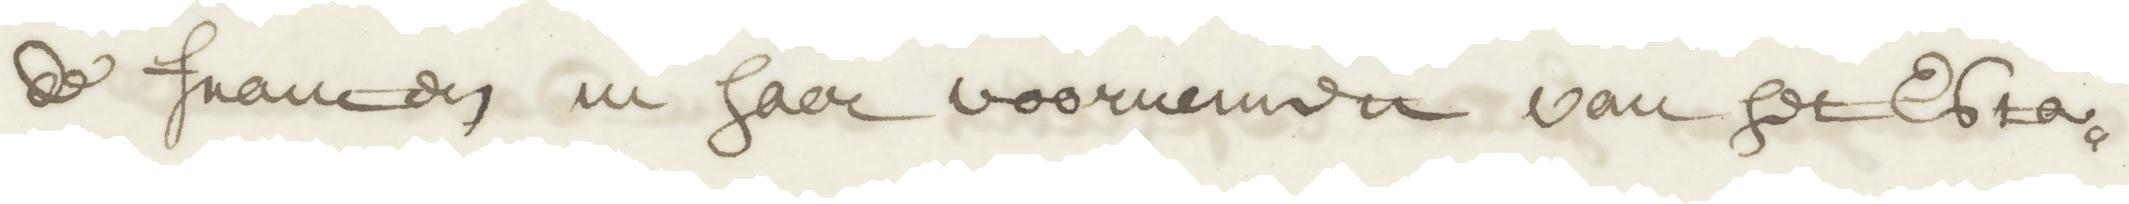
de francen in haer voornemen van het Esta
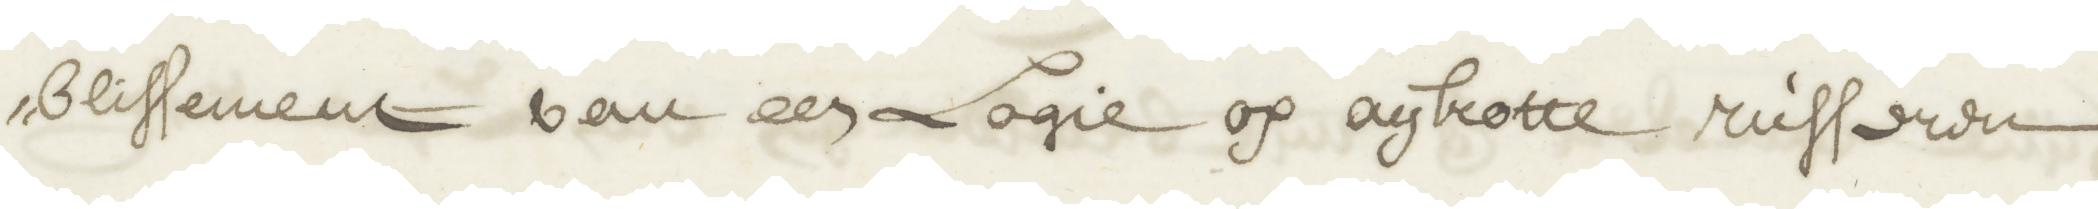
„blissement van een Logie op aijkotte russeren
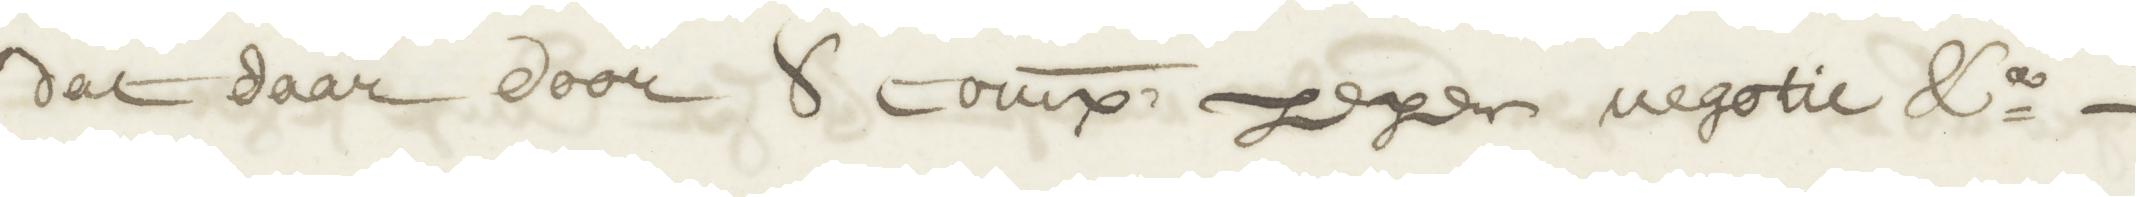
dat daar door S comp: peper negotie &=a —
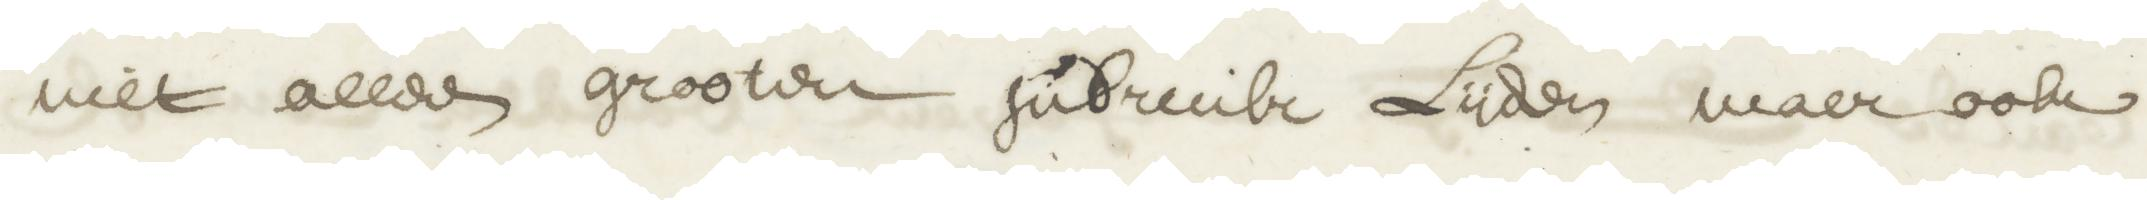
niet alleen grooten jnbreuk Lijden maer ook
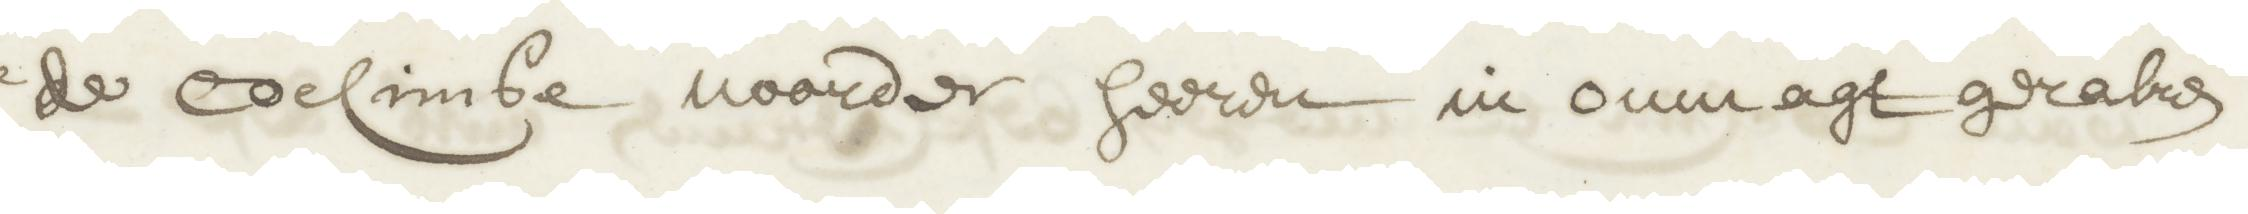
de cochimse noorder heeren in onmagt geraken
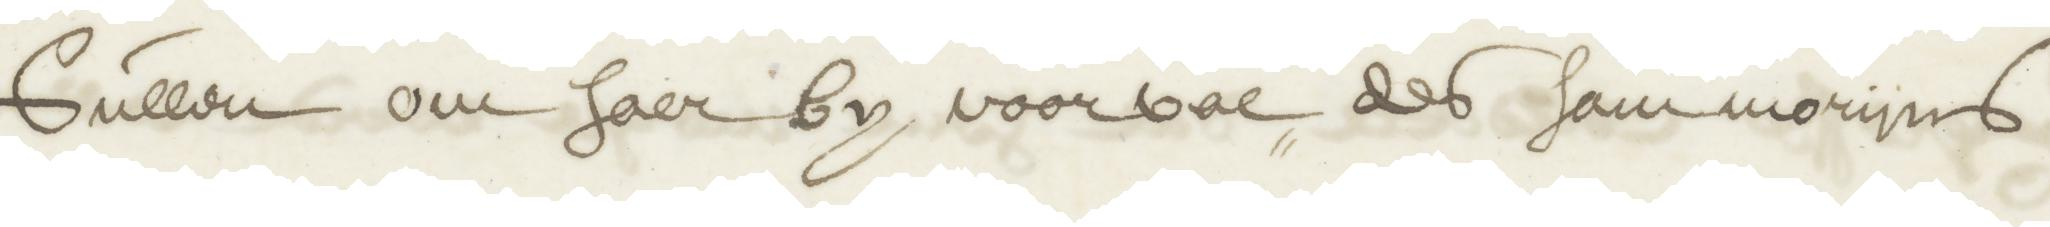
sullen om haer by voorval„ des sammorijns
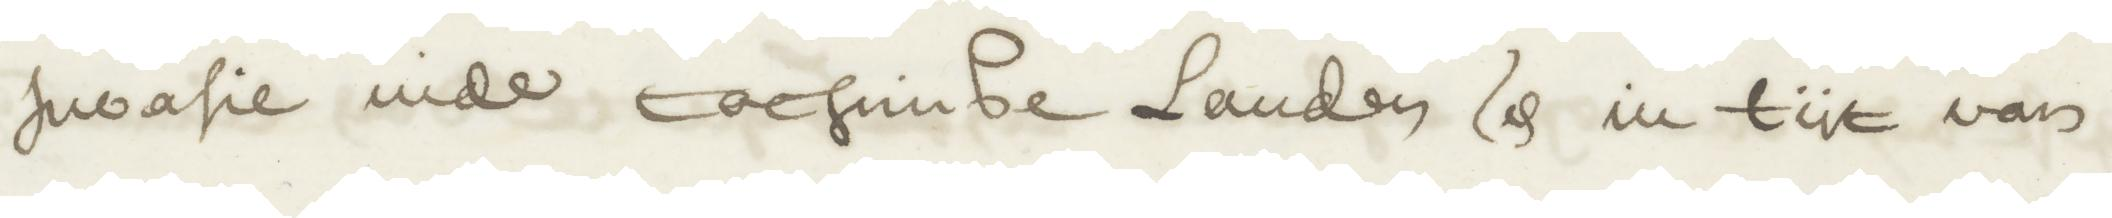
jnvasie inde cochimse Landen en in tijt van
